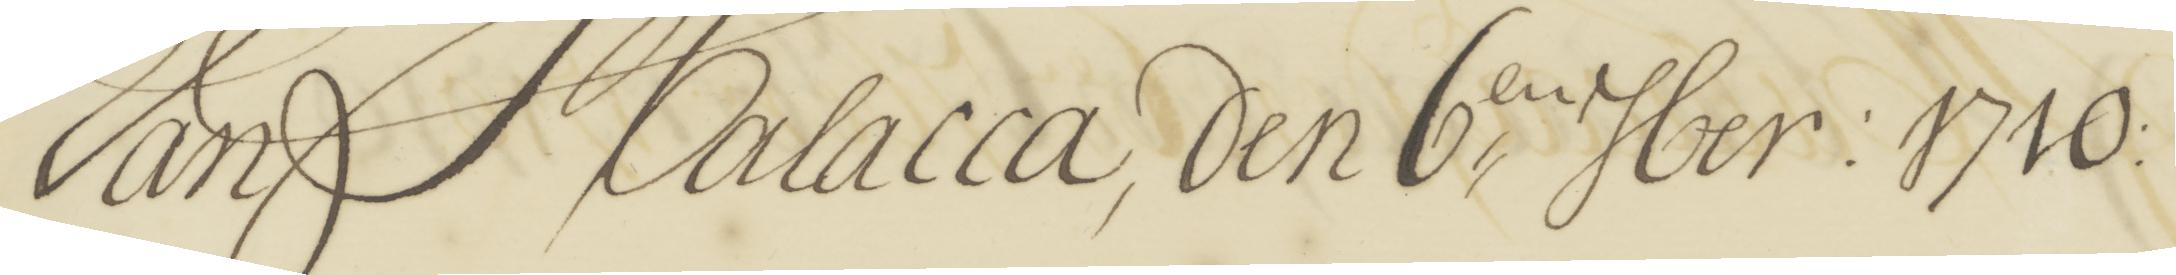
Van Malacca, den 6„en 7ber: 1710:
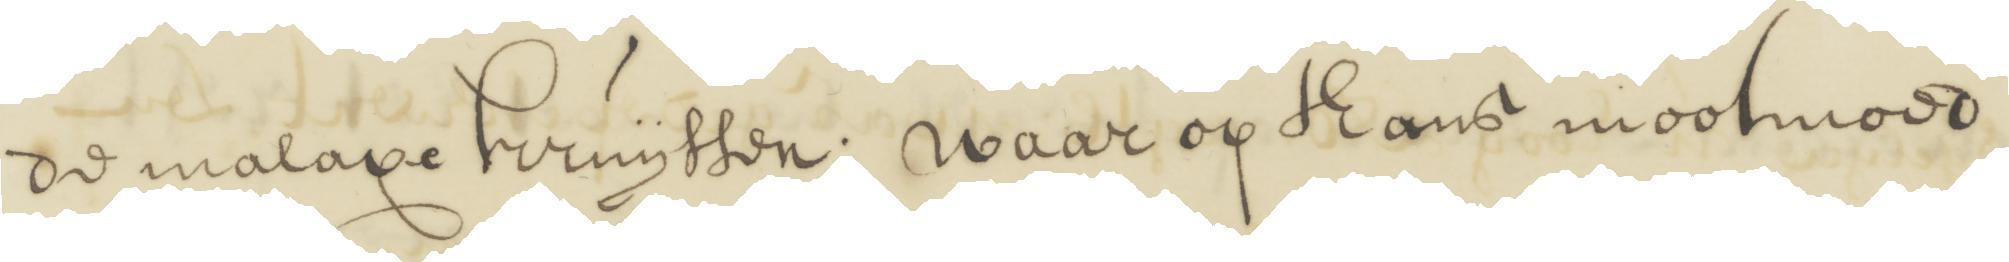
de malaxe kruijsser; waar op thans in ootmoed
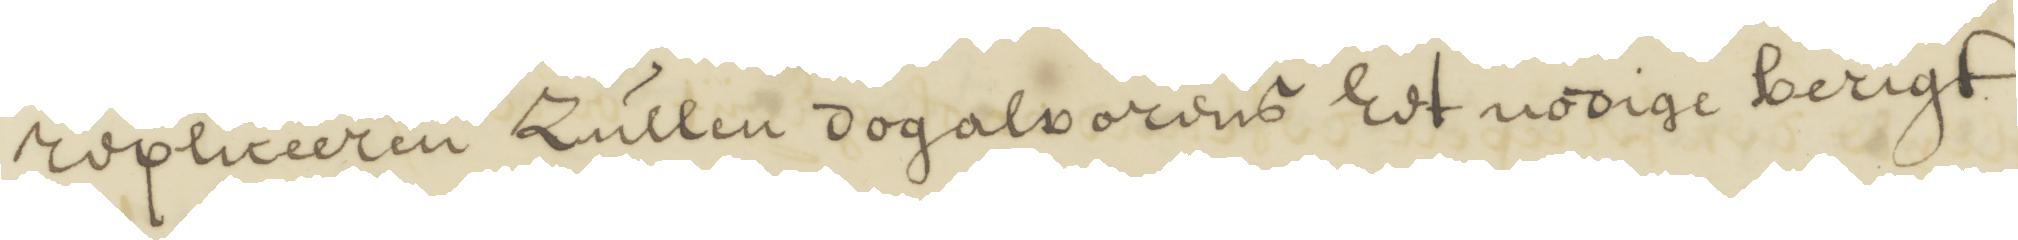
repliceeren zullen dog alvorens het nodige berigt
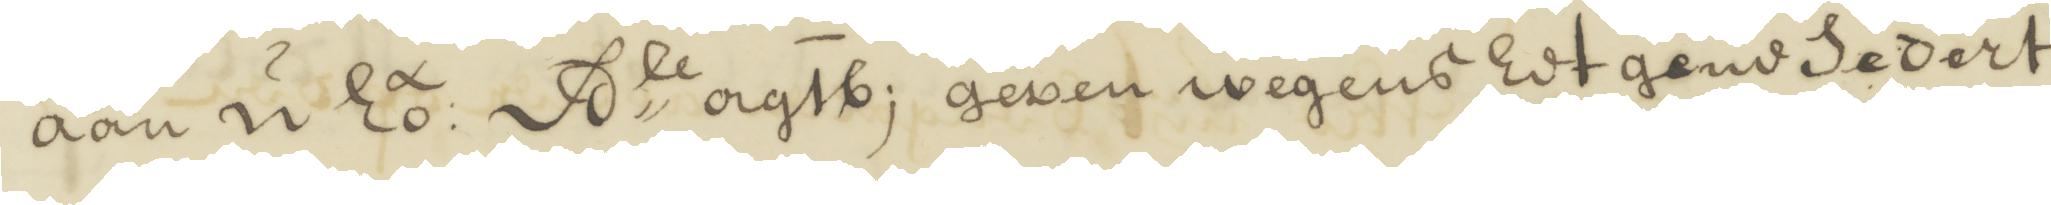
aan u ho: Ed„le agtb; geven wegens het gene Sedert
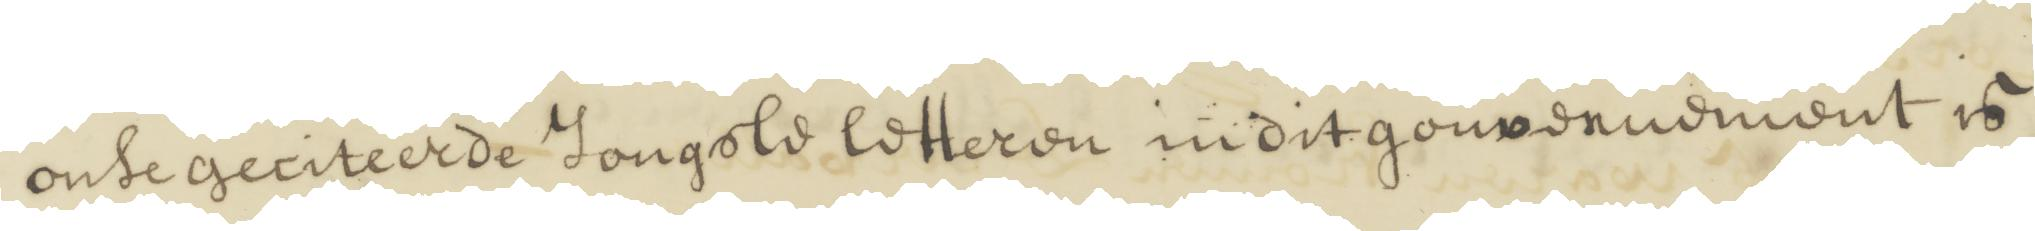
onse geciteerde Iongste letteren in dit gouvernement is
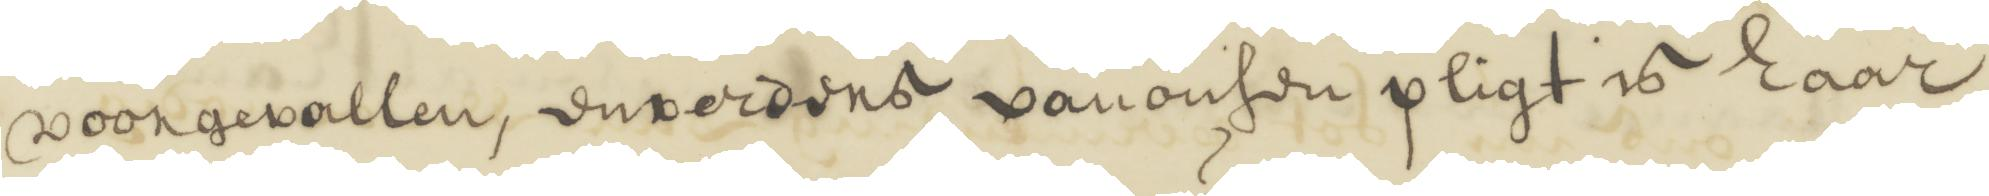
voorgevallen, en verders van onsen pligt is haar
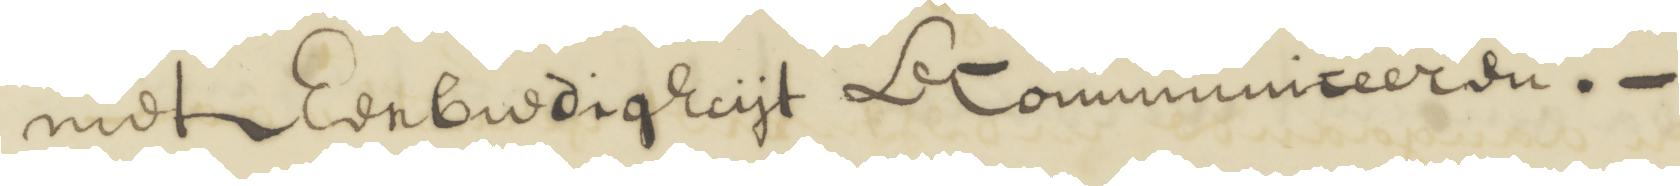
met Eerbiedigheijt te Communiceeren. -
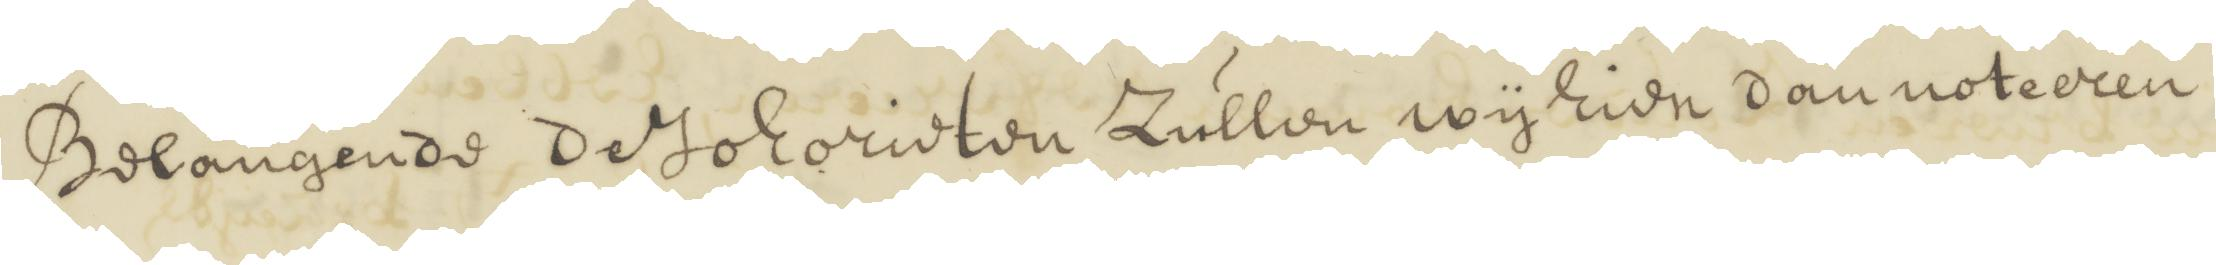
Belangende deIohorieten Zullen wij hier dan noteeren
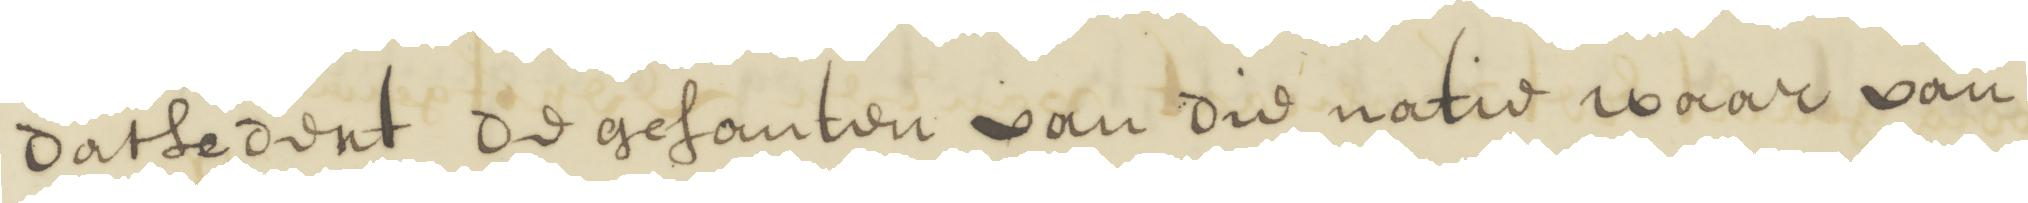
datsedert de gesanten van die natie waar van
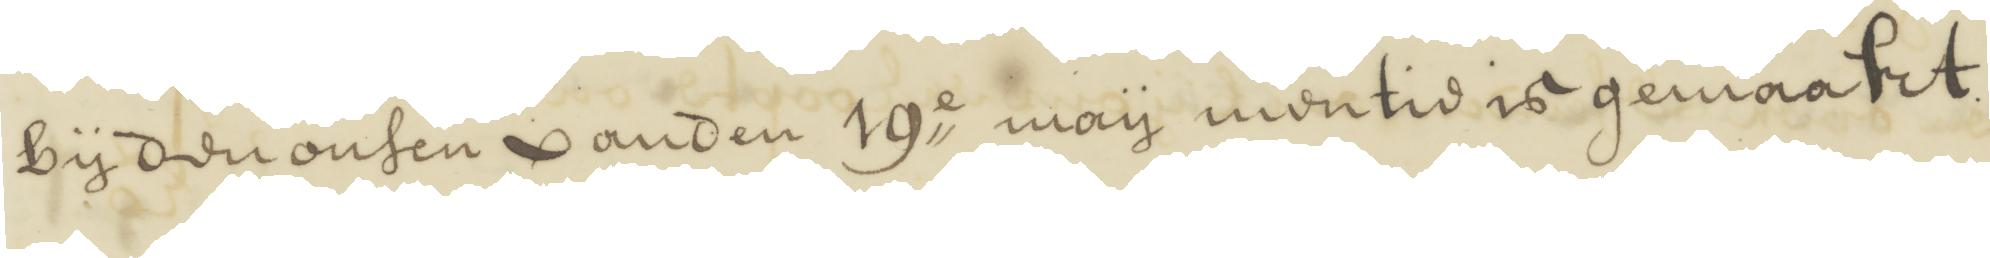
bij den onsen van den 19„e maij mentie is gemaakt
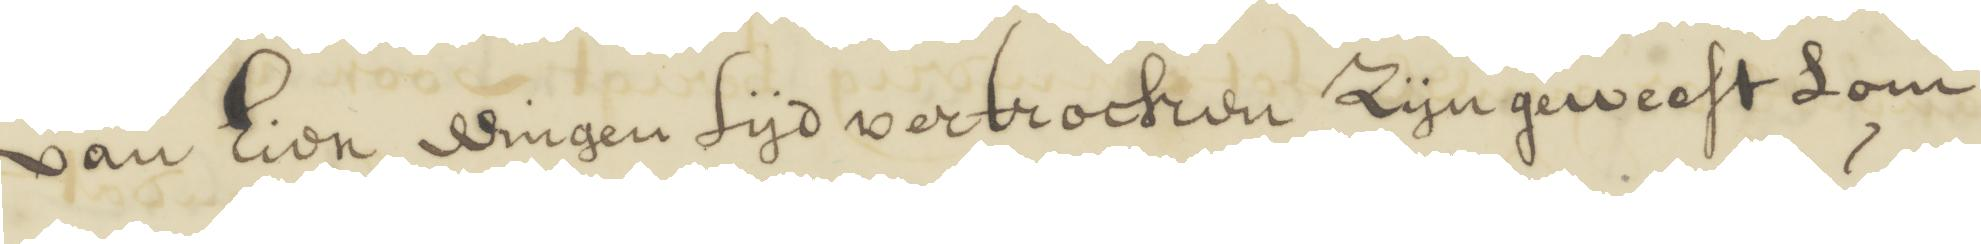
van hier eenigen tijd vertrocken Zijn geweest som
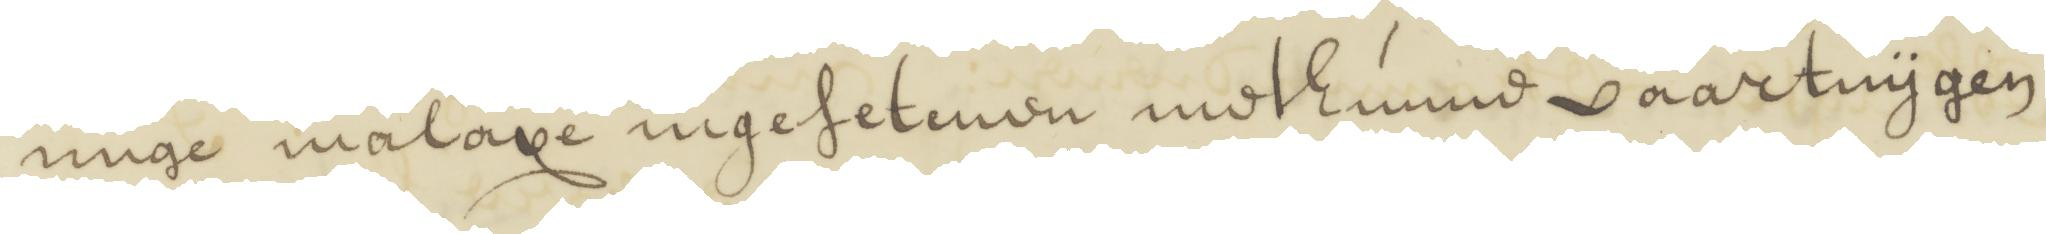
mige malaxe ingesetenen met hunne vaartuijgen
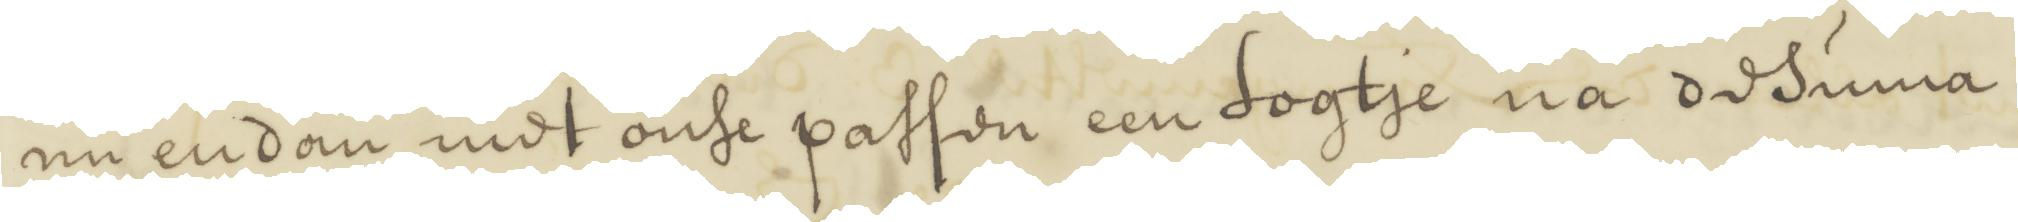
nu en dan met onse passen een togtje na desuma
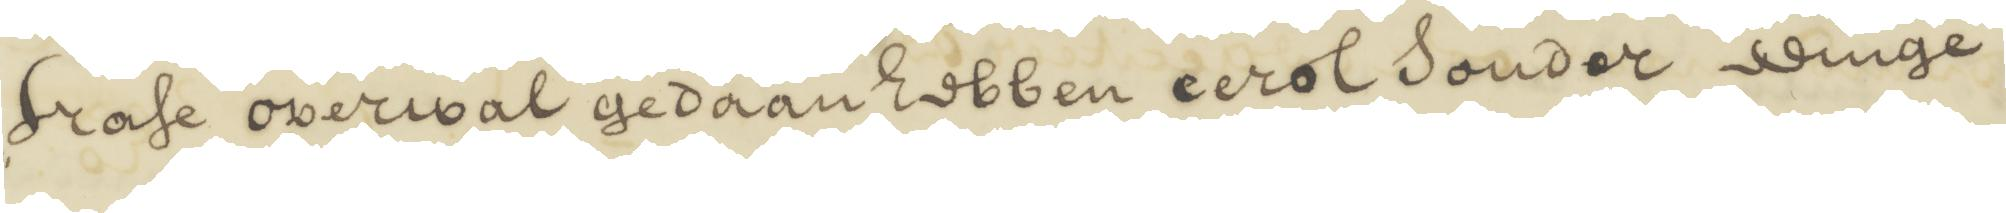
„trase overwal gedaan hebben eerst sonder eenige
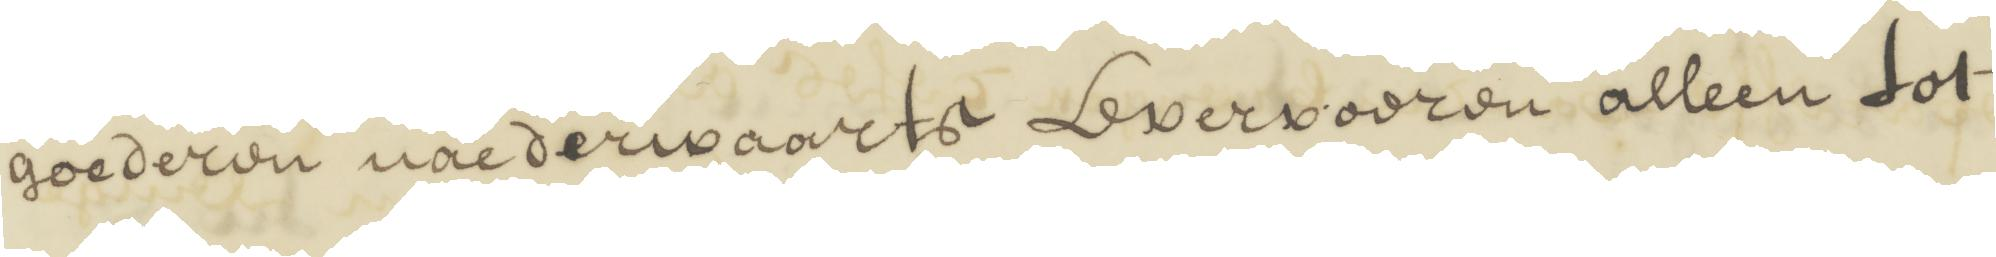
goederen nae derwaarts te vervoeren alleen tot
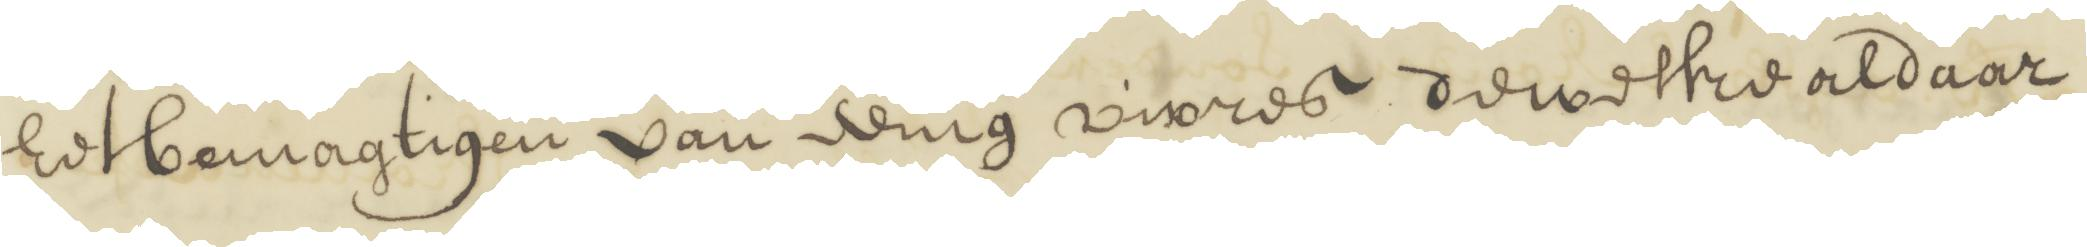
het bemagtigen van eenig vivres dewelke aldaar
